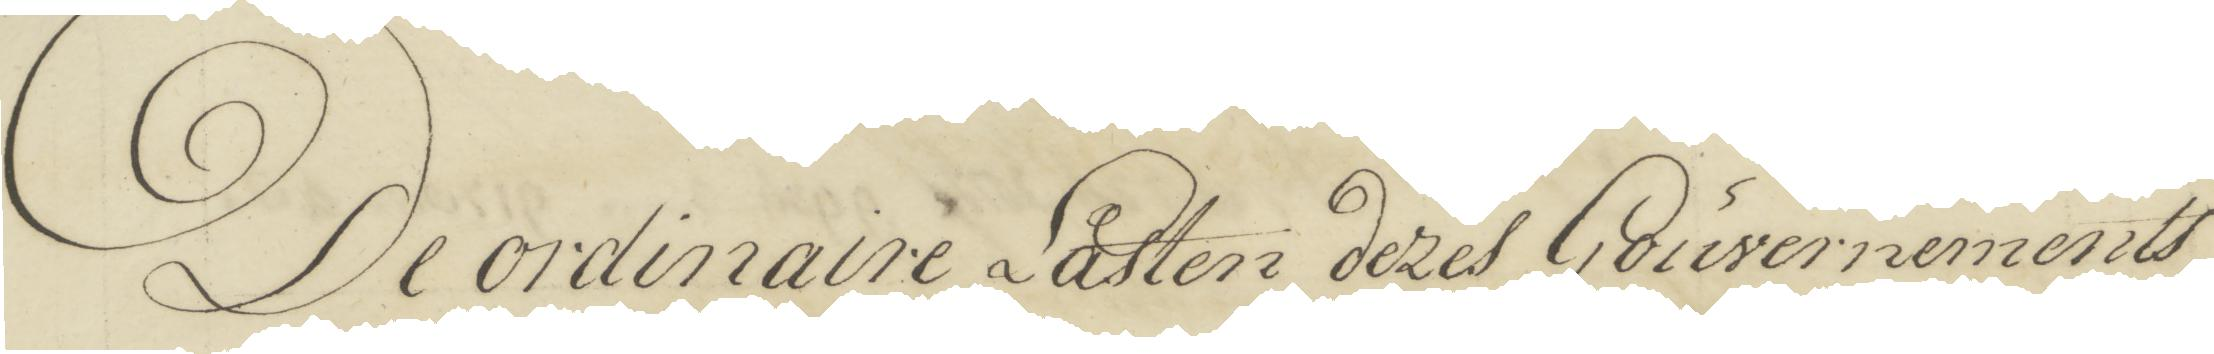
De ordinaire Lasten dezes Gouvernements
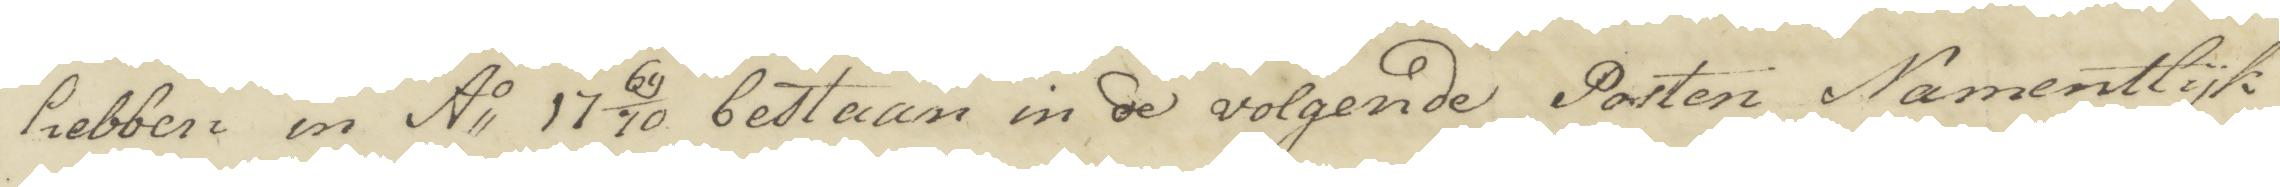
hebben en A„o 17 69/70 bestaan in de volgende Posten Namentlijk
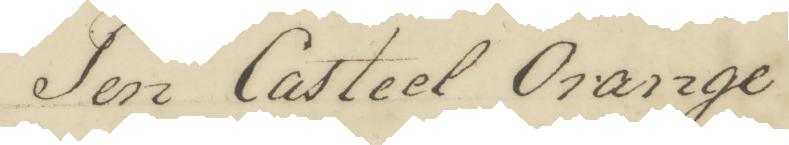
Ten Casteel Orange
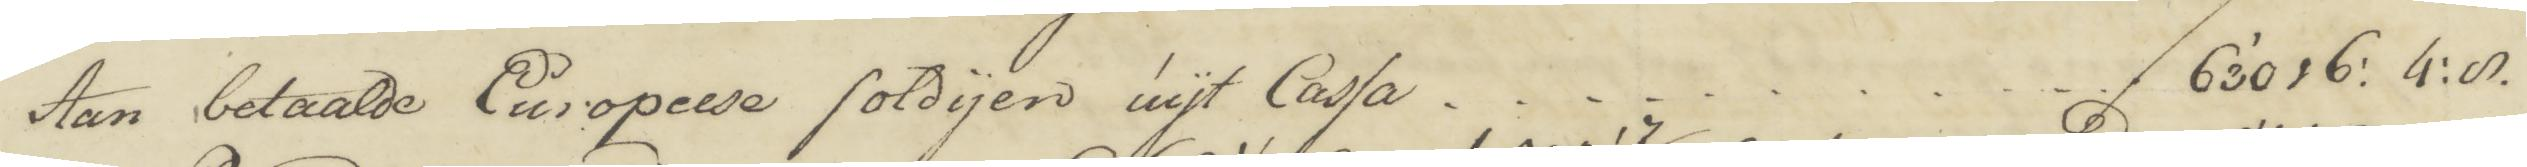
Aan betaalde Europeese soldijen uijt Cassa - - - - - - - - - - - ƒ 63'016: 4:8.
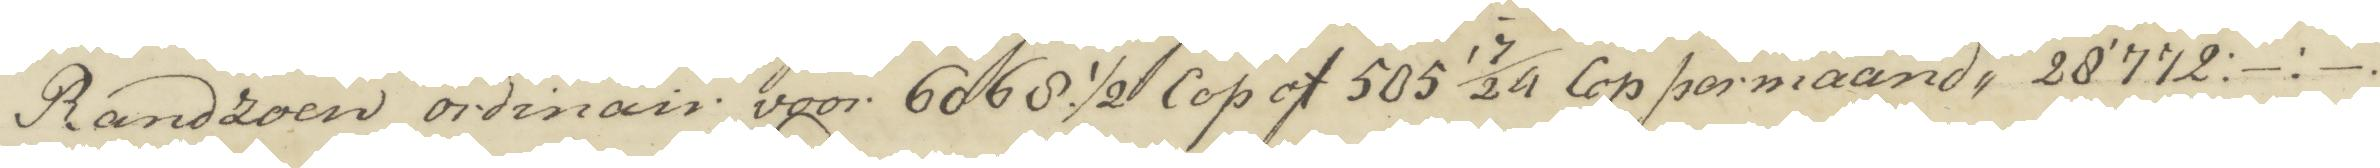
Randzoen ordinair voor 6068½ Cop of 505 17/24 Cop per maand „ 28'772:—:—.
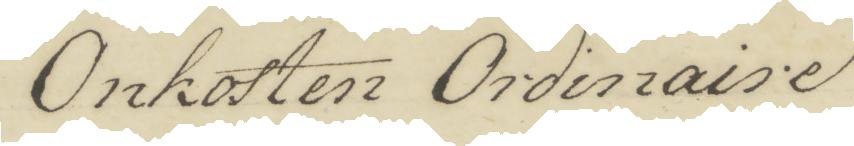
Onkosten Ordinaire
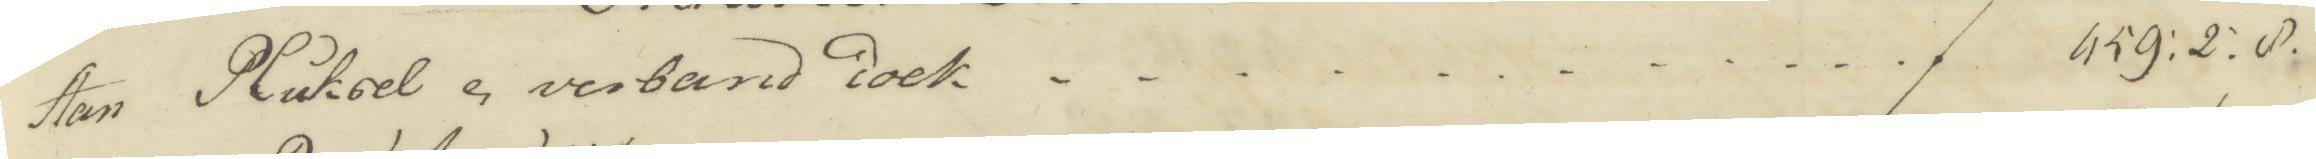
Aan Pluksel en verband doek - - - - - - - - - - - - ƒ 459:2:8.
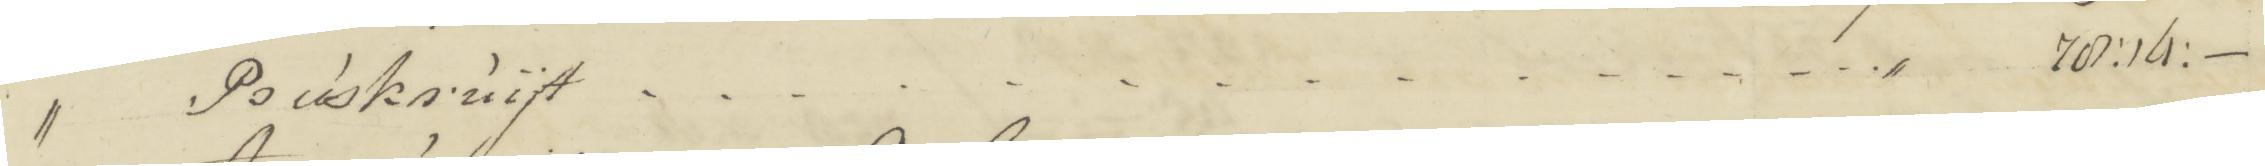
„ Buskruijt - - - - - - - - - - - - - - - „78:14:—
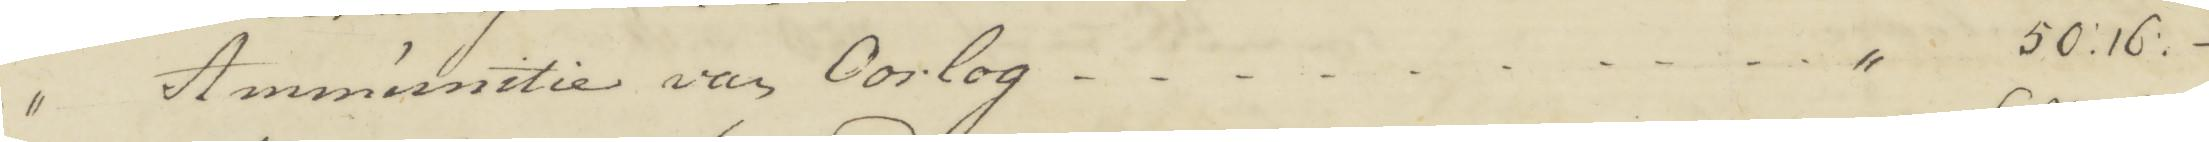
„ Ammunitie van Oorlog - - - - - - - - - - „ 50:16:—
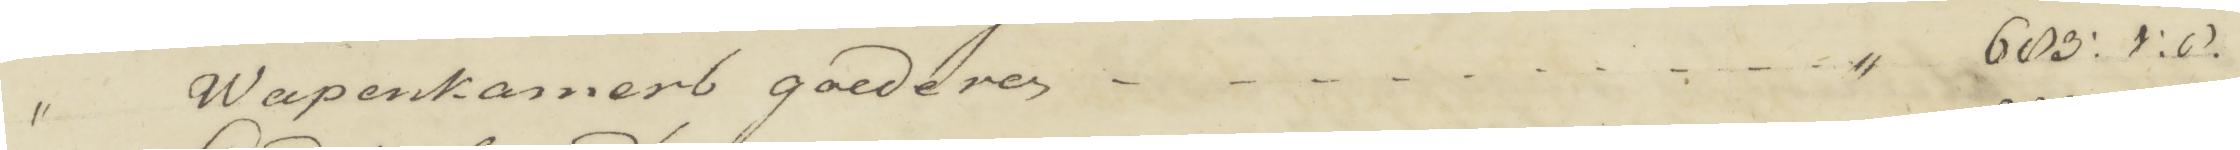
„ Wapenkamers goederen - - - - - - - - - - „ 683: 1:8.
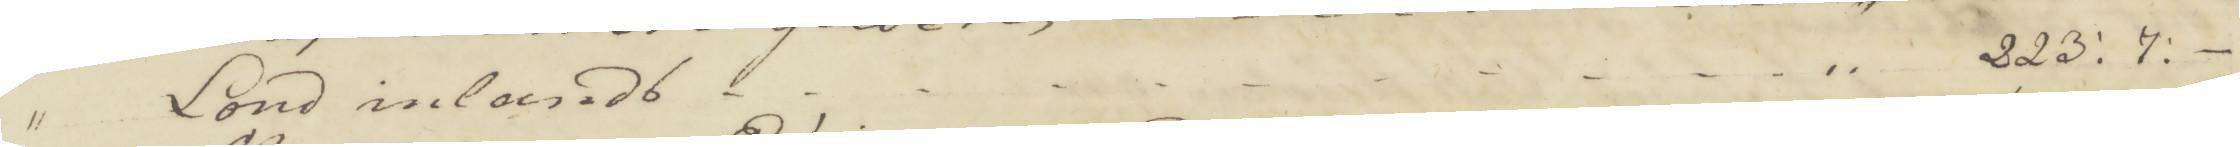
„ Lond inlands - - - - - - - - - - - „ 223: 7:—
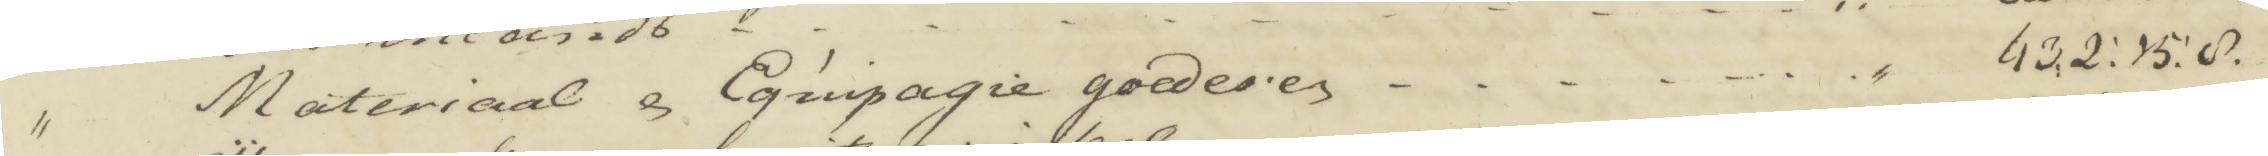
„ Materiaal en Equipagie goederen - - - - - - - „ 432:15:8.
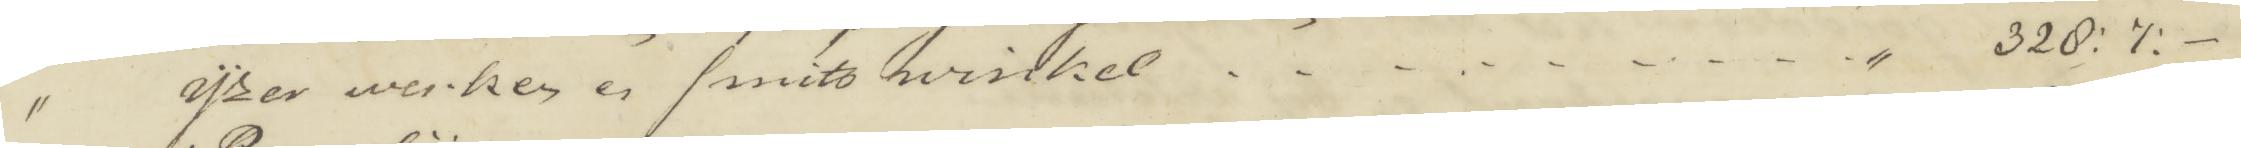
„ ijzer werken en smits winkel - - - - - - - - „ 328: 7:—
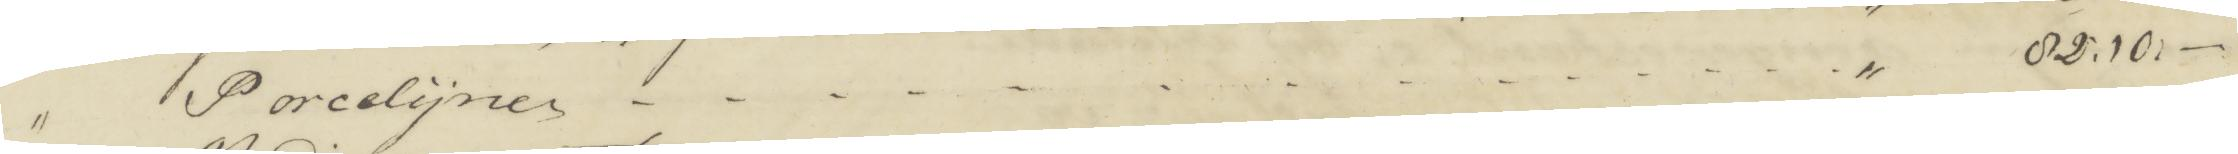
„ Porcelijnen - - - - - - - - - - - - - - „ 82:10:—
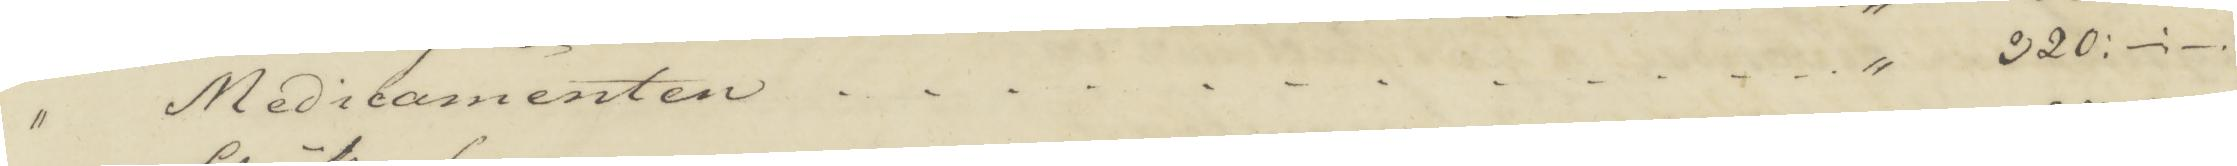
„ Medicamenten - - - - - - - - - - - - - „ 320:—:—.
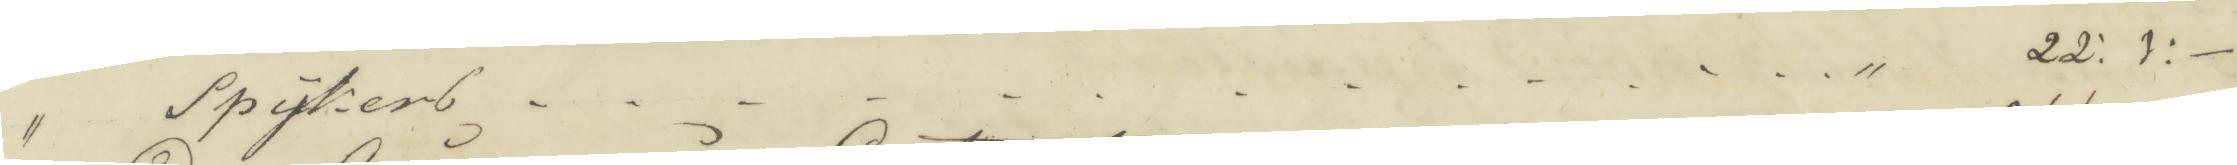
„ Spijkers - - - - - - - - - - - - - - „ 22: 1:—
